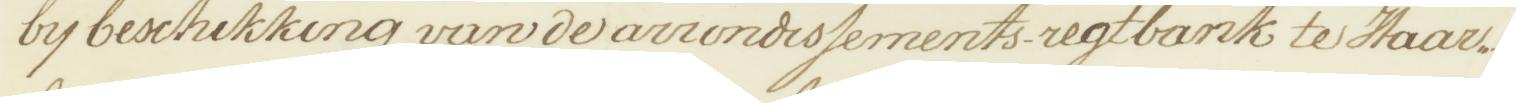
by beschikking van de arrondissements regtbank te Haar„
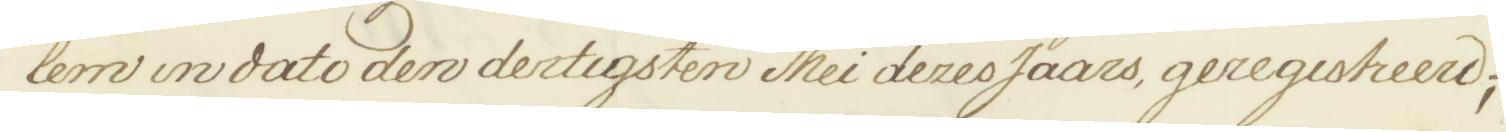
lem in dato den dertigsten Mei dezes Jaars, geregistreerd,
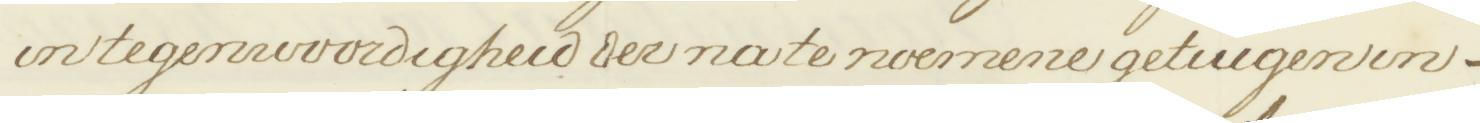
in tegenwoordigheid der na te noemene getuigen in
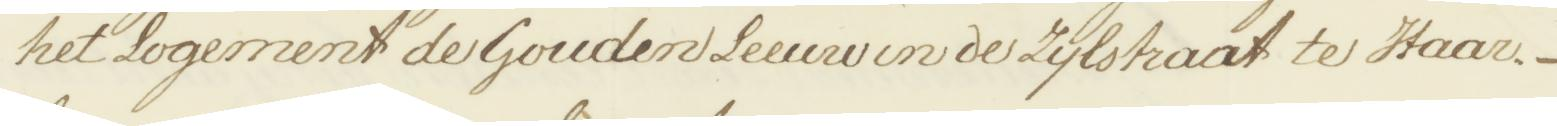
het Logement de Gouden Leeuw in de Zylstraat te Haar„
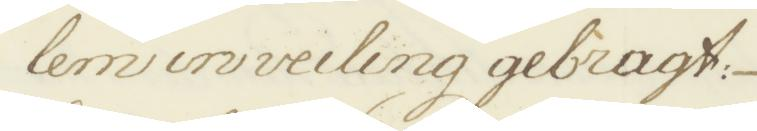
lem in veiling gebragt:
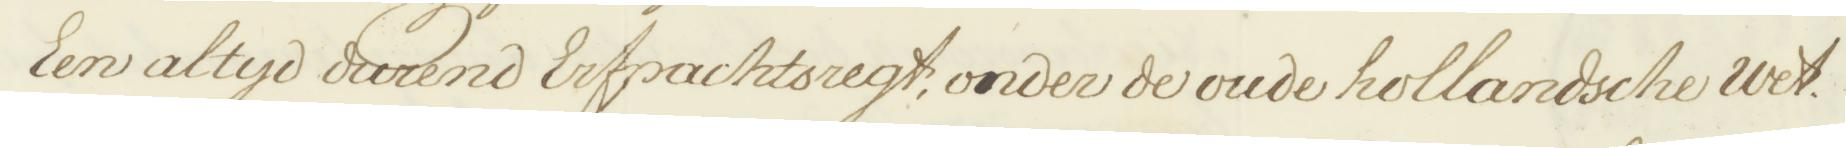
Een altyd durend Erfpachtsregt, onder de oude hollandsche wet.
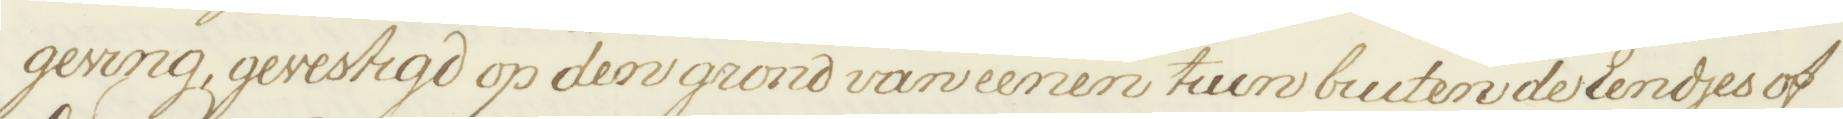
geving, gevestigd op den grond van eenen tuin buiten de Eendjes of
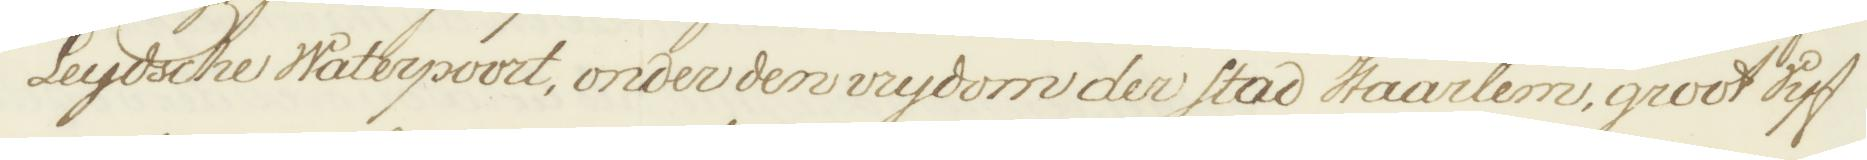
Leydsche Waterpoort, onder den vrydom der stad Haarlem, groot vyf
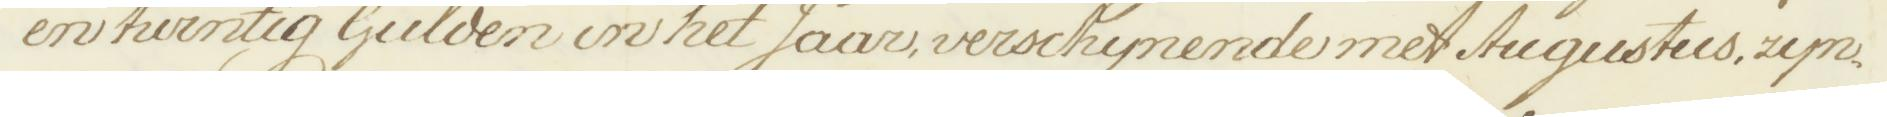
en twintig Gulden in het Jaar, verschynende met Augustus, zyn„
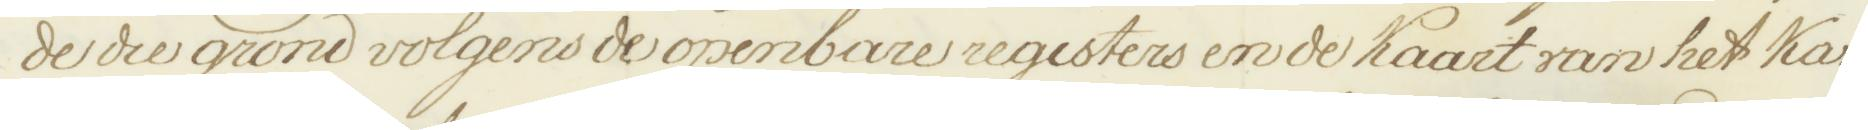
de die grond volgens de openbare registers en de kaart van het Ka.
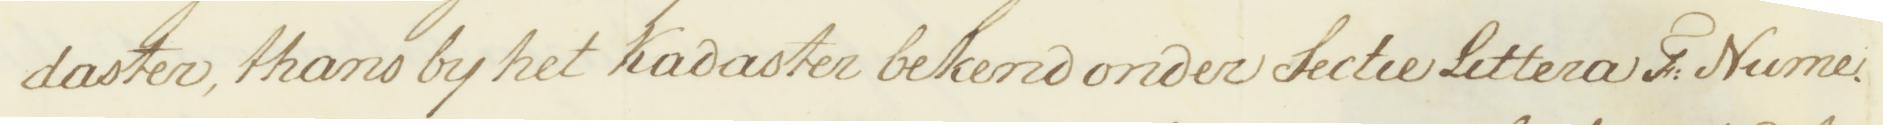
daster, thans by het kadaster bekend onder sectie Littera F: Nume.
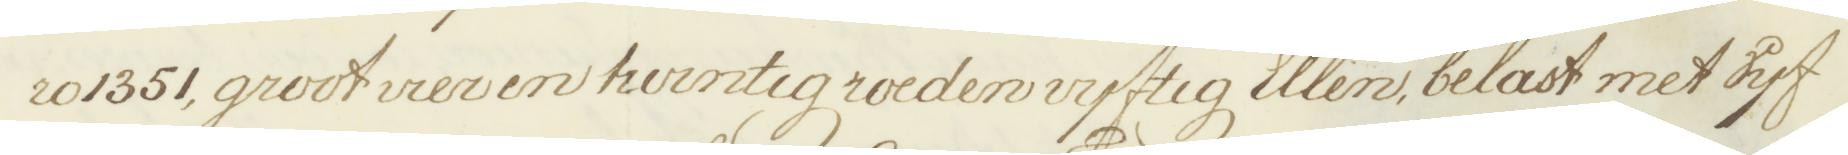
ro 1351, groot vier en twintig roeden vyftig Ellen, belast met vyf
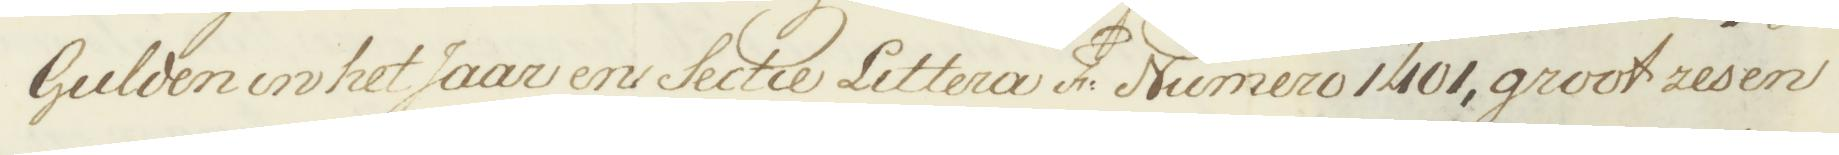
Gulden in het Jaar en sectie Littera F. Numero 1401, groot zesen
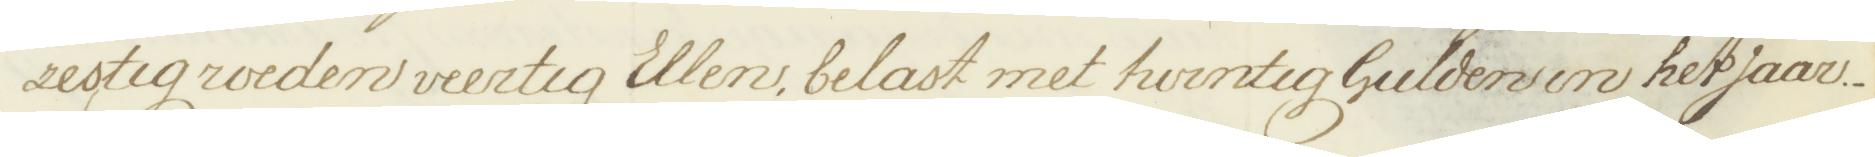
zestig roeden veertig Ellen, belast met twintig Gulden in het Jaar.
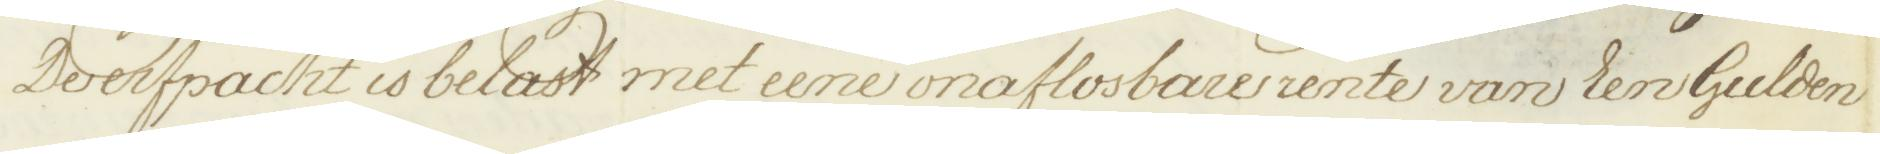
De erfpacht is belast met eene onaflosbare rente van Een Gulden
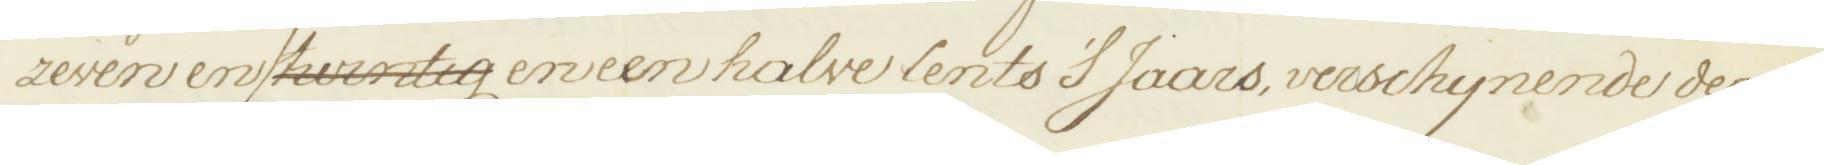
zeven en ¶ twintig en een halve Cents 's Jaars, verschynende den
